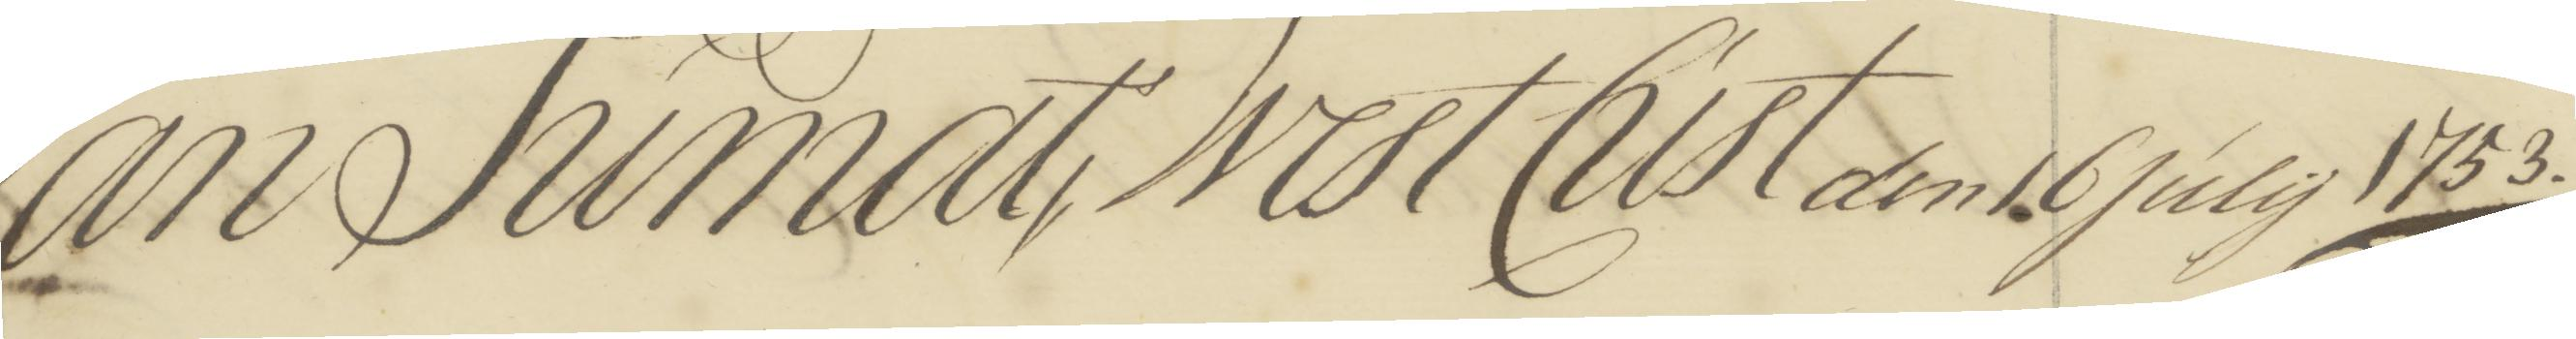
Van Sumat„s west cust den 16 Julij 1753.
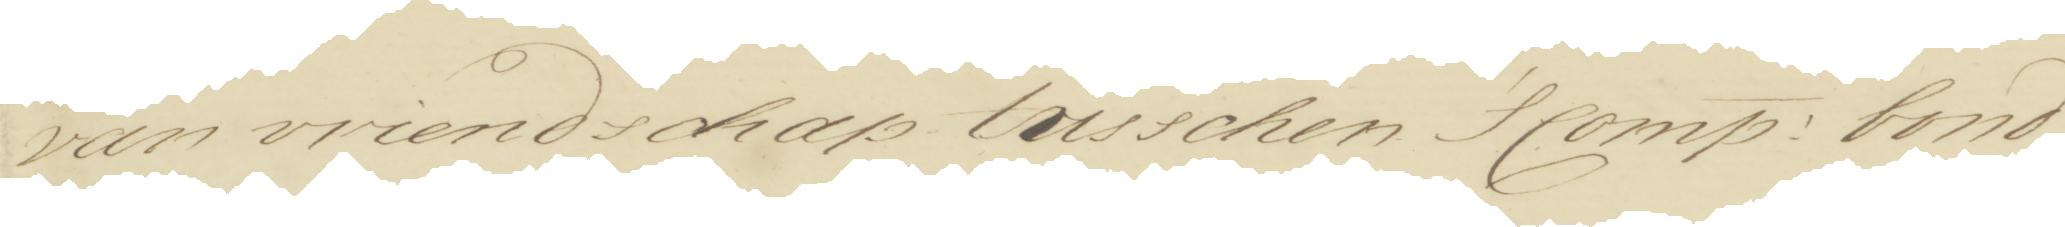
van vriendschap tusschen ’scomp: bond
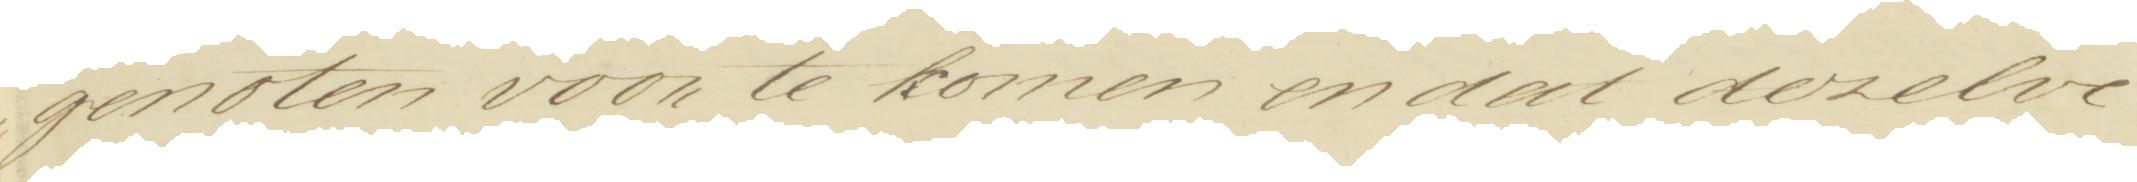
„genoten voor te komen en dat dezelve
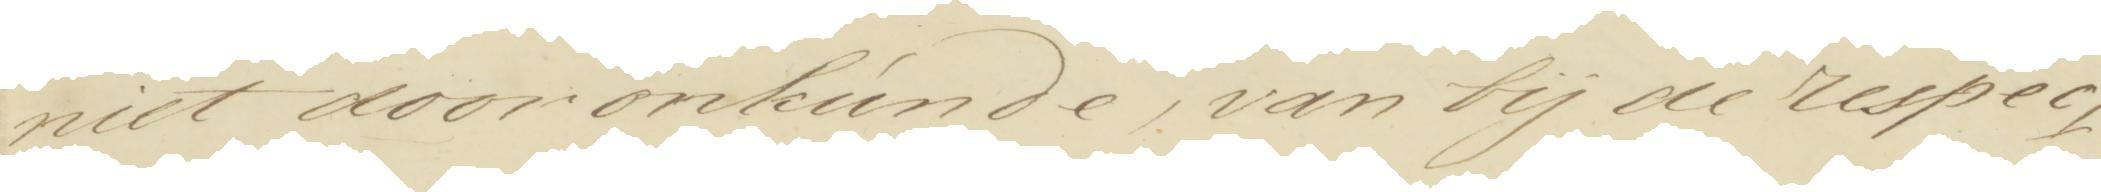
niet door onkunde, van bij de respec„
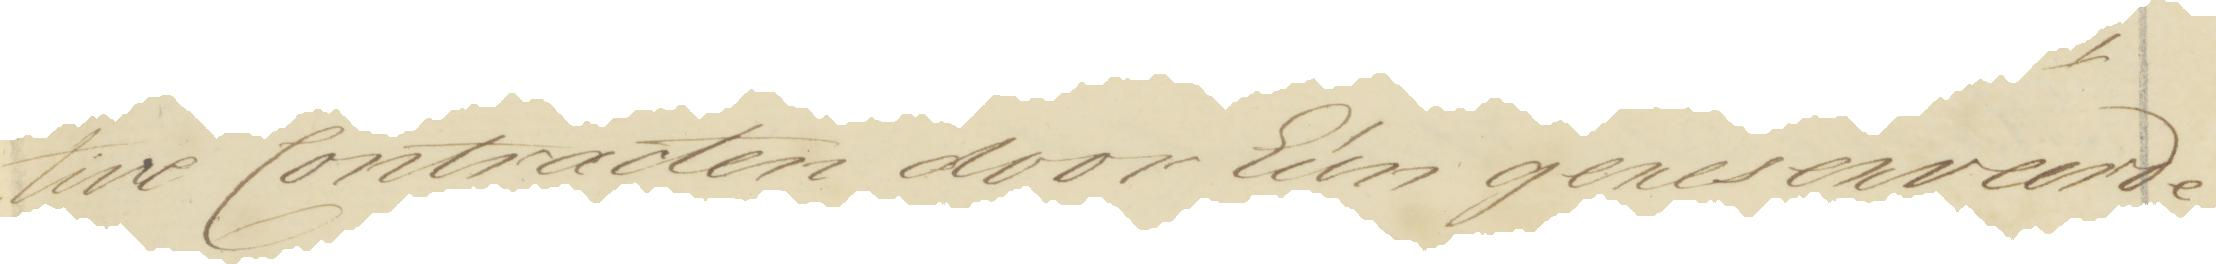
tive contracten door hun gereserveerde
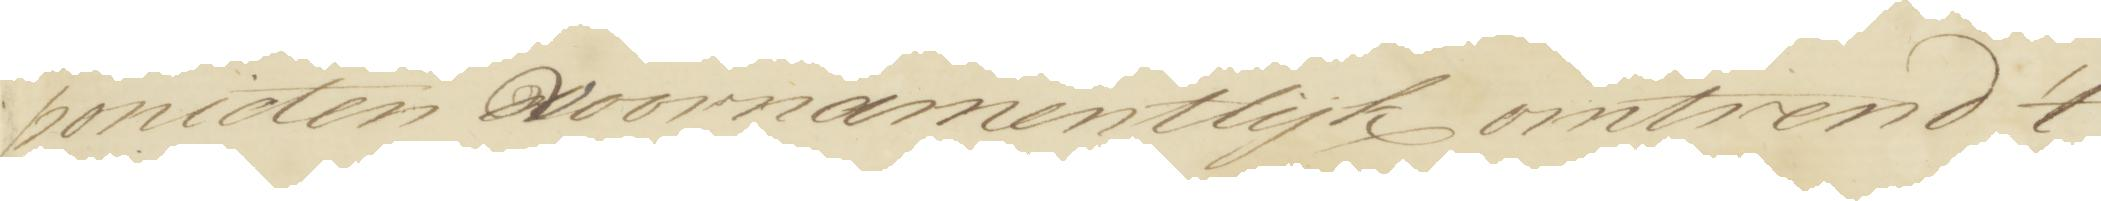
ponicten voornamentlijk omtrend 't
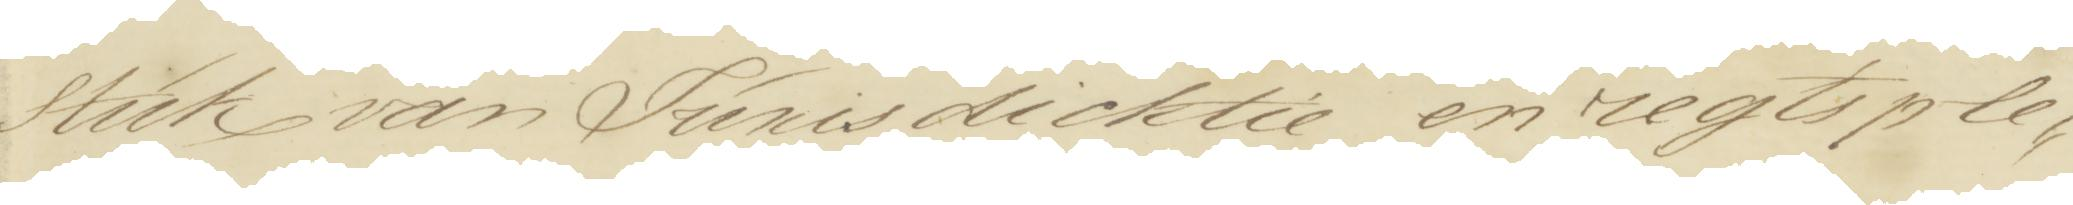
stuk van Jurisdicktie en regtsple
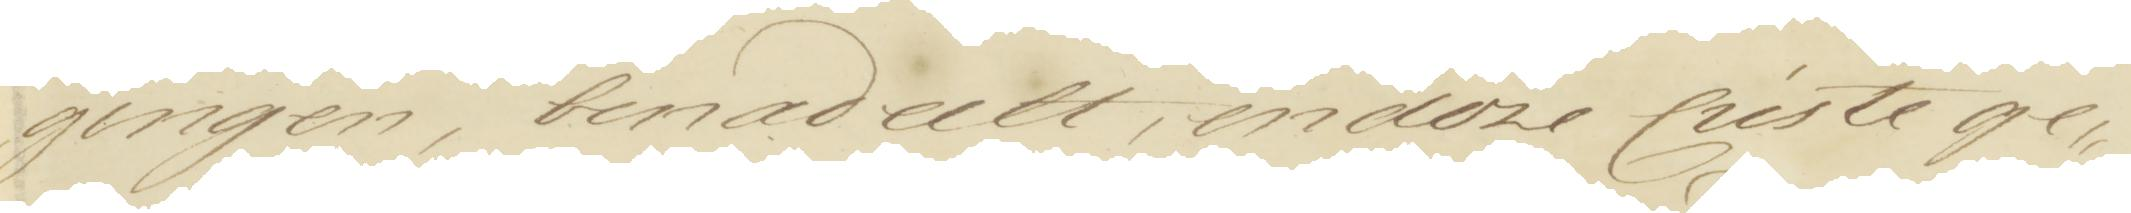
„gingen, benadeelt, en deze custe ge„
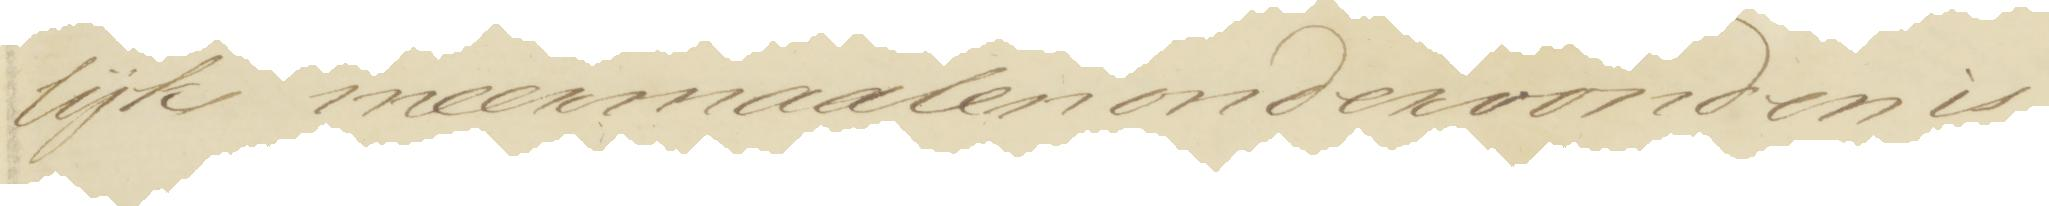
lijk meermaalen ondervonden is,
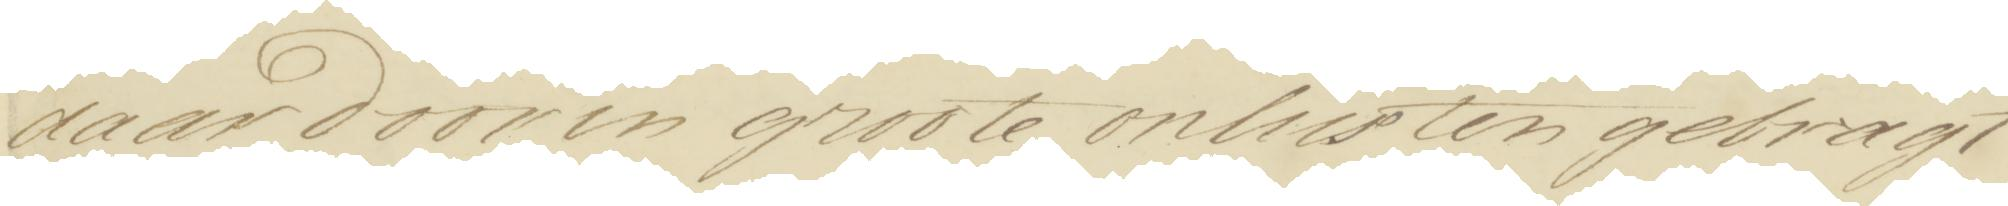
daar door in groote onlusten gebragt
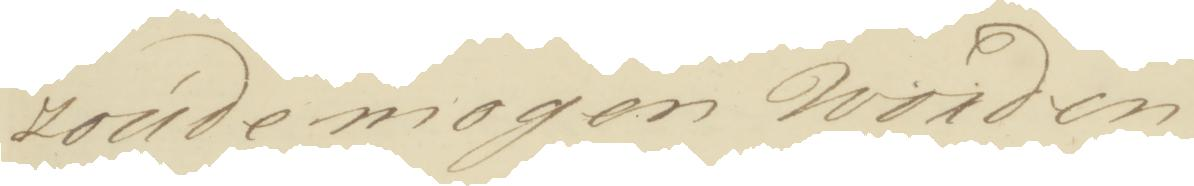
zoude mogen worden
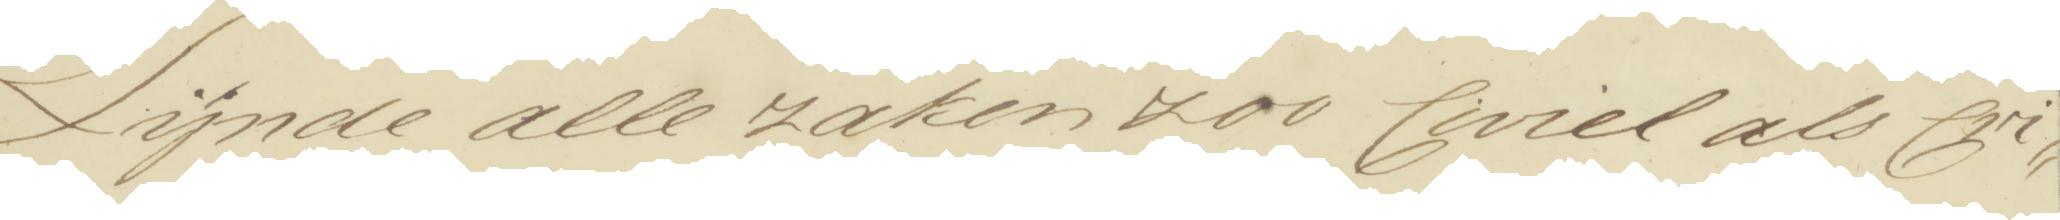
Zijnde alle zaken zoo civiel als cri
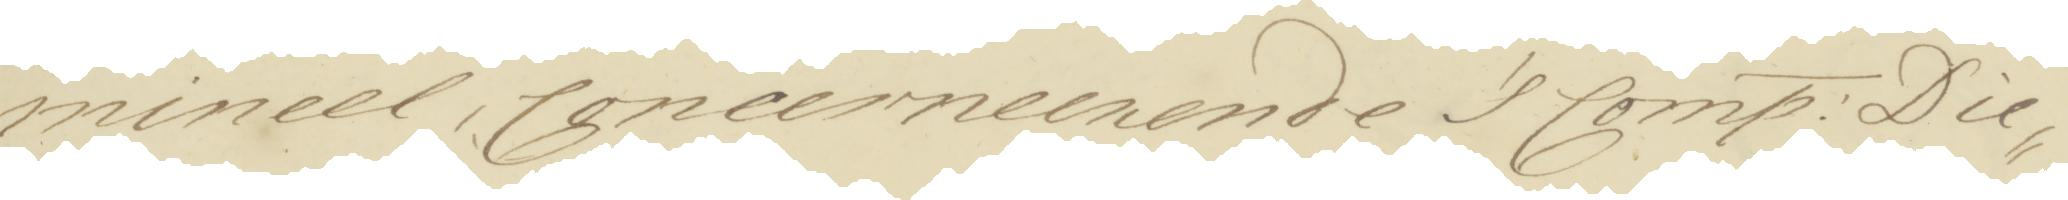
„mineel, concerneerende 's comp: Die„
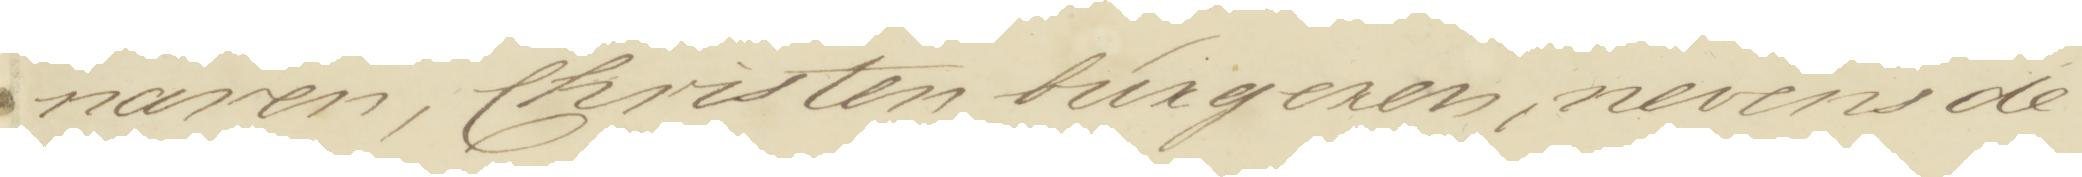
naren, christen burgeren, nevens de
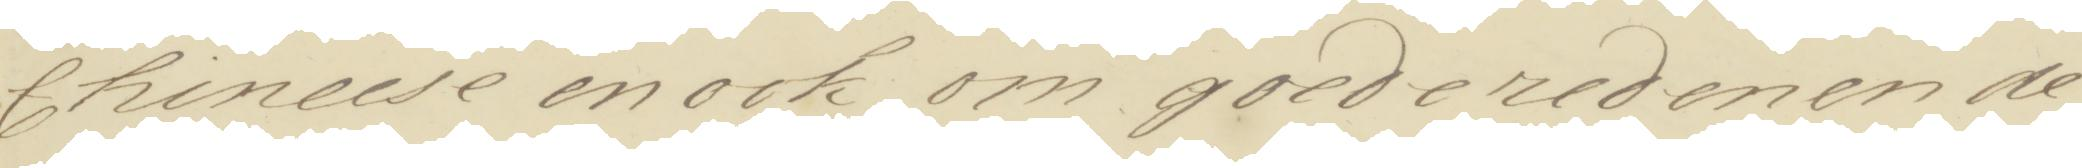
Chineese en ook om goede redenen de
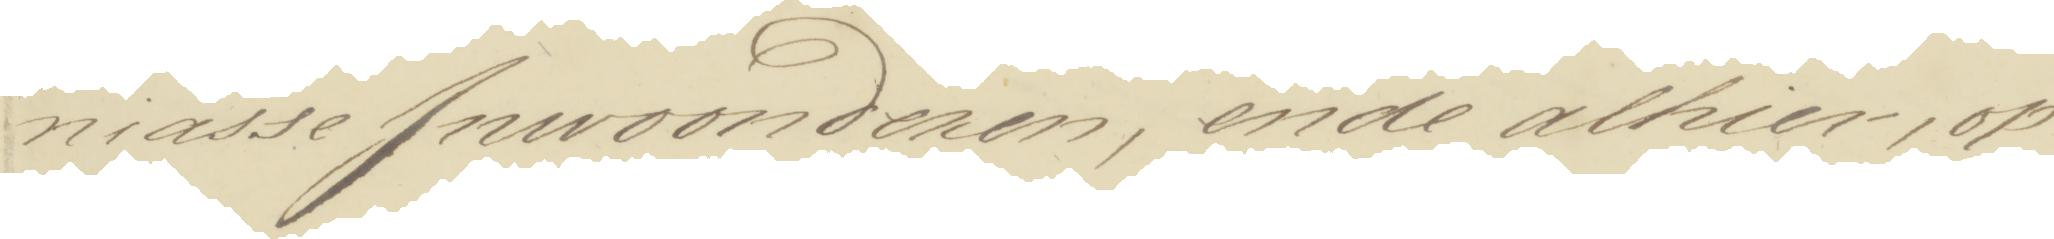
niasse Inwoonderen, ende alhier, op
